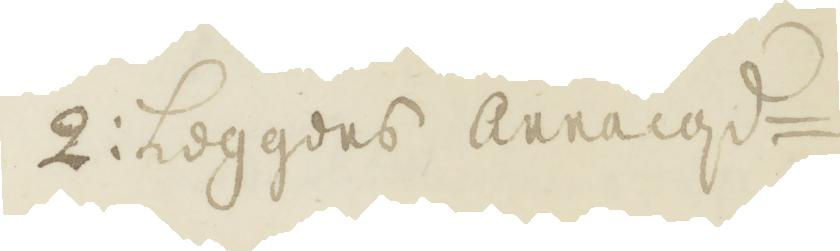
2: Leggers arracqe=
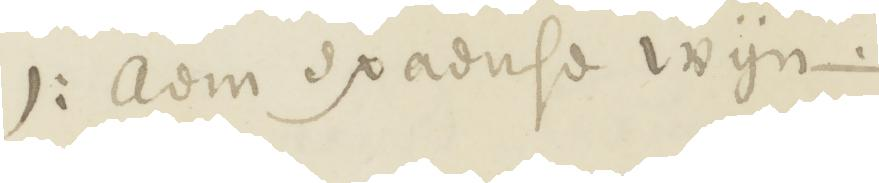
1: aem spaense wijn.
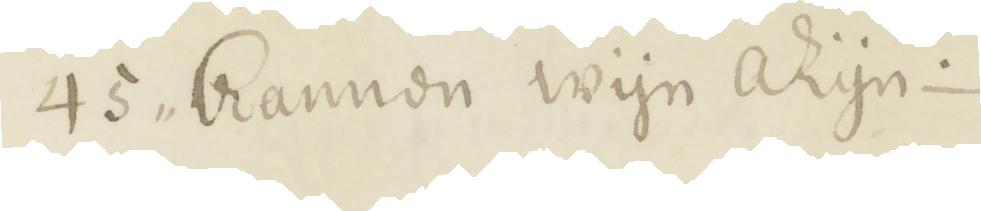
45„ kannen wijn azijn.
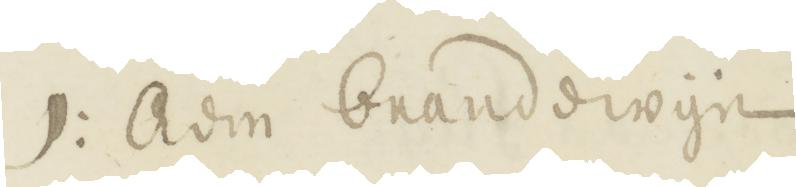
1: aem brandewijn.
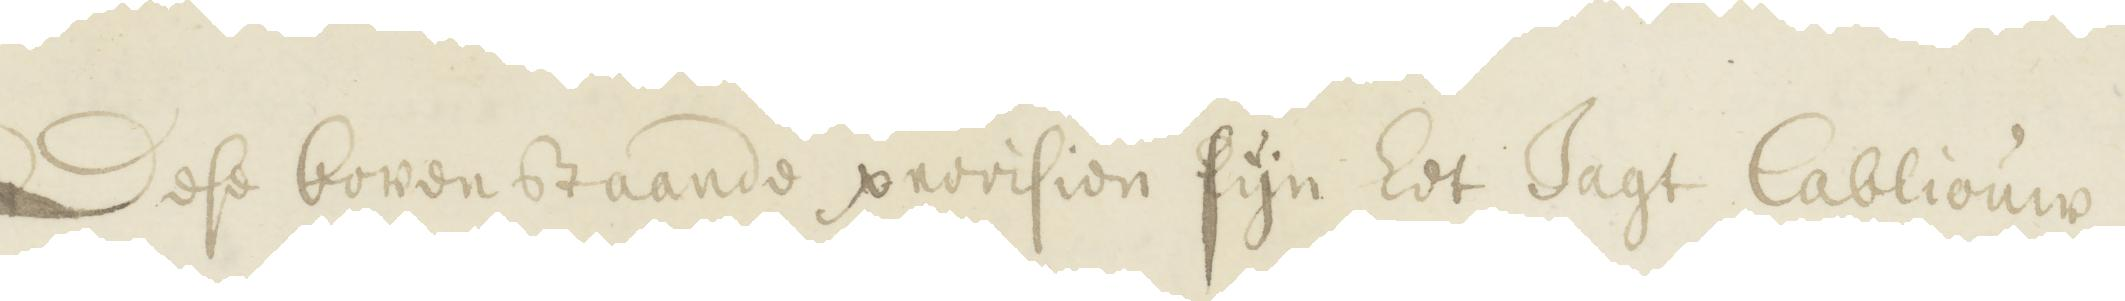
Dese boven staande provisien sijn het Jagt Cabliouw
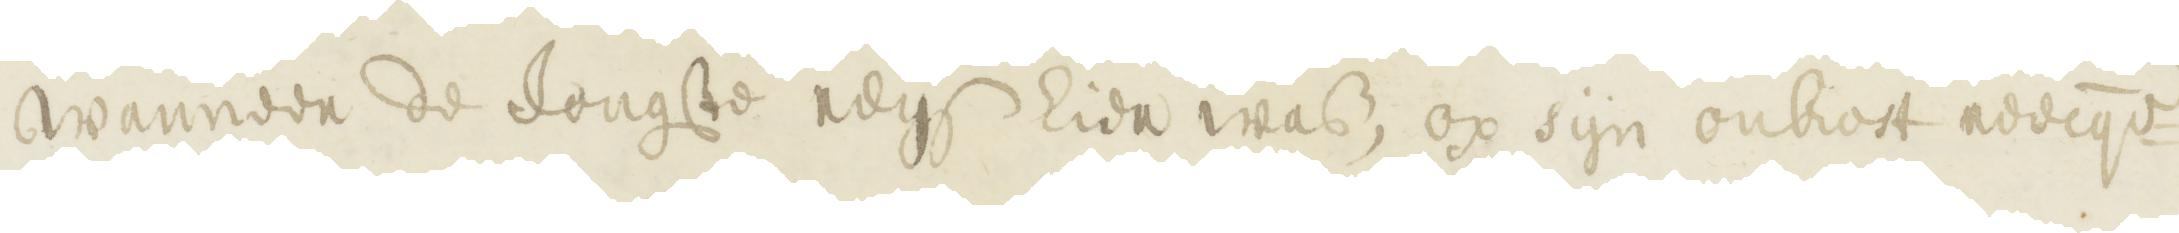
wanneer de Jongte reijs hier was, op sijn onkost reecqe
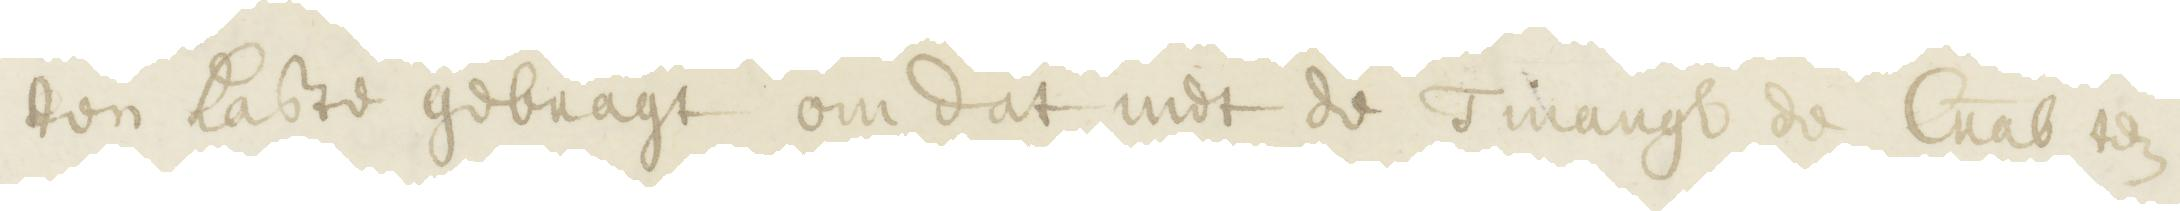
ten laste gebragt om dat met de Tinangh de Crab ten
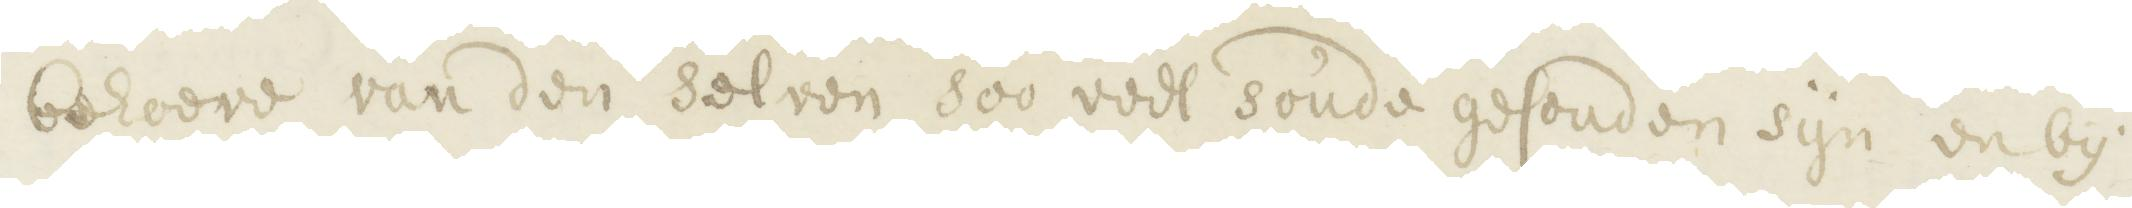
behoeve van den selven soo veel soude gesonden sijn en bij
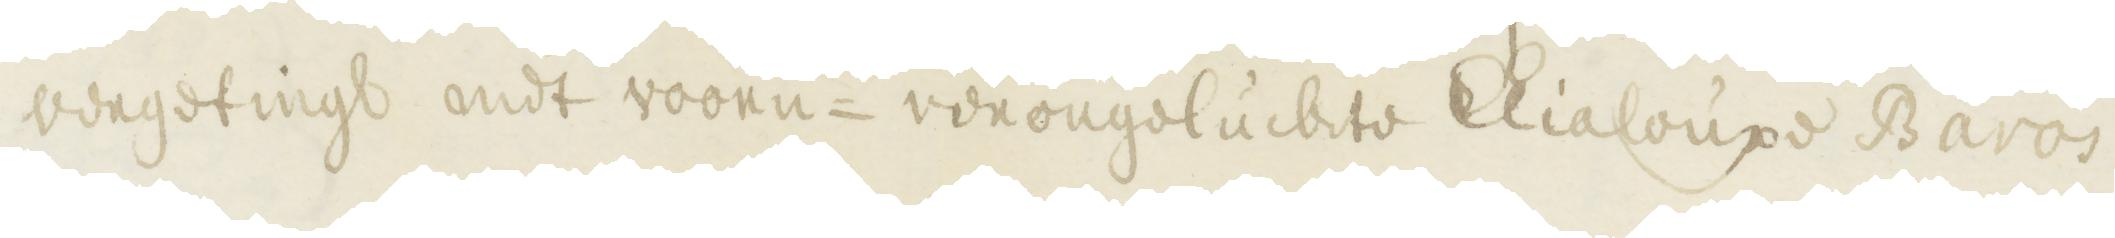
vergetingh met voorn=e verongeluckte Chialoupe Baros
